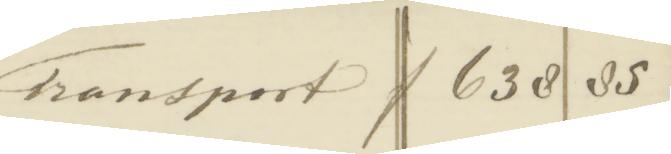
Transport ƒ 638 85
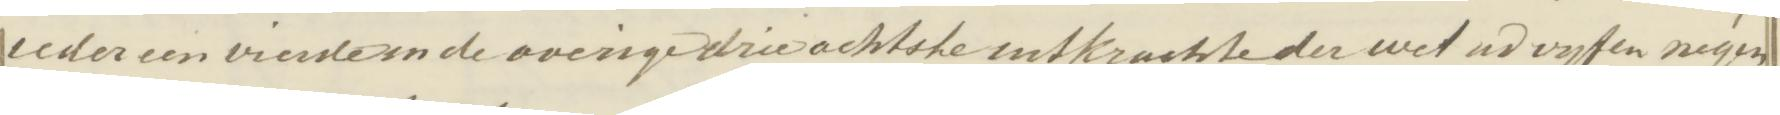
ieder een vierde in de overige drie achtste uit krachte der wet ad vyf en negen
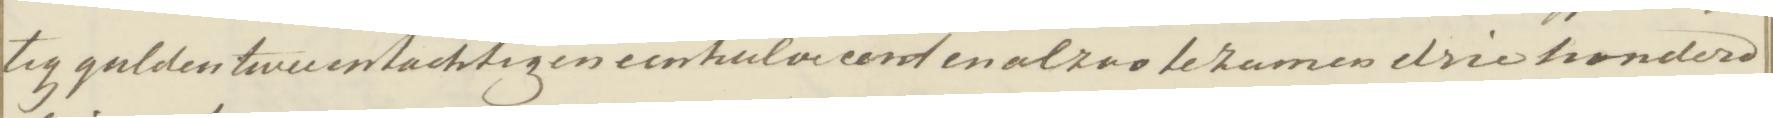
tig gulden twee en tachtig en een halve cent en alzoo tezamen drie honderd
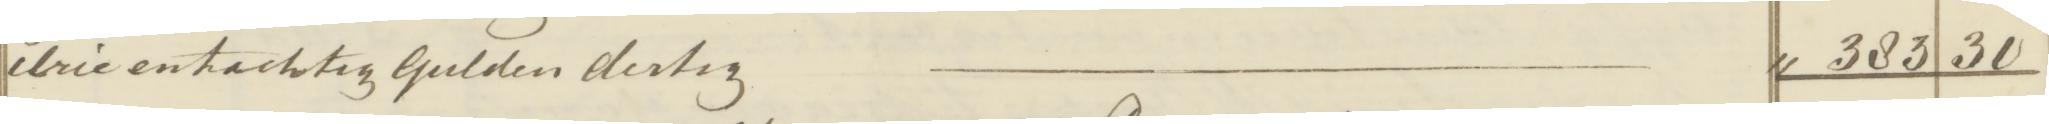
drie en tachtig Gulden dertig „ 383 30
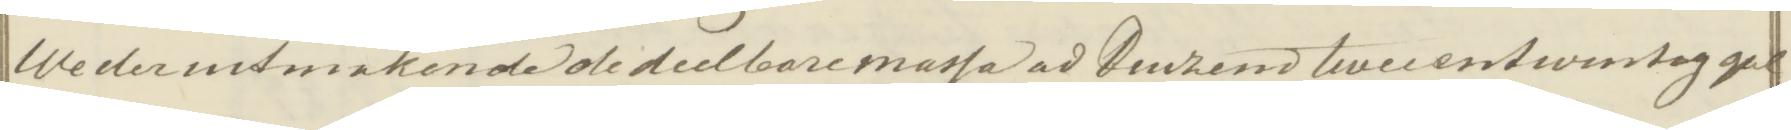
Weder uitmakende de deelbare massa ad duizend twee en twintig gul
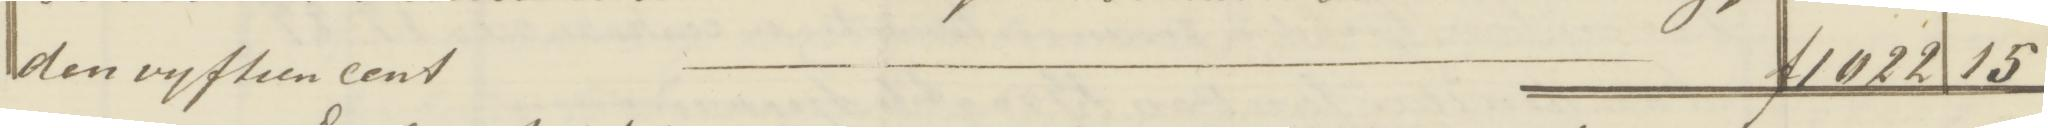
den vyftien cent ƒ1022 15
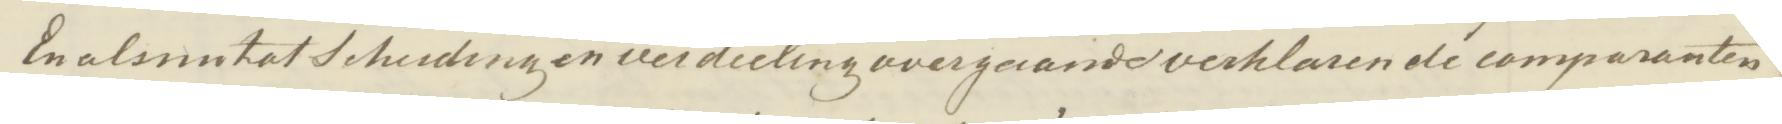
En alsnu tot scheiding en verdeeling overgaande verklarende comparanten
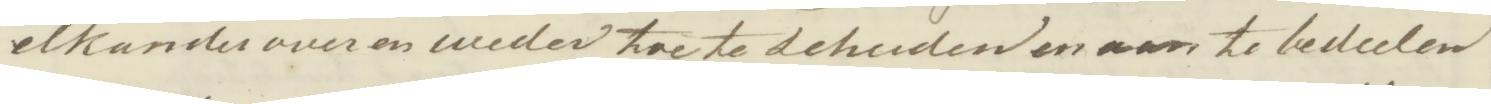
elkander over en weder toe te scheiden en aan te bedeelen
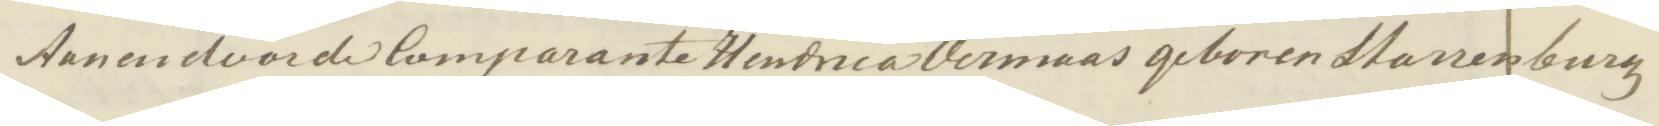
Aan en door de Comparante Hendrica Vermaas geboren starrenburg
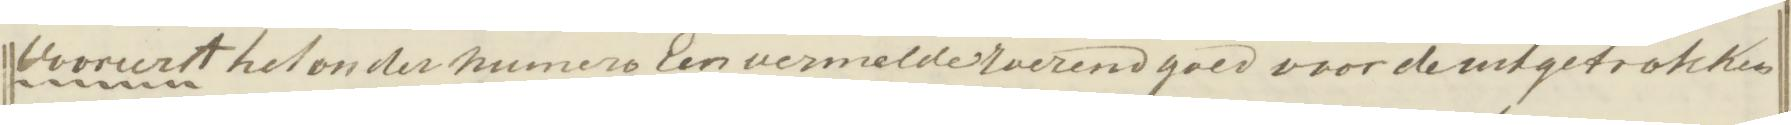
Vooreerst het onder numero Een vermelde Roerend goed voor de uitgetrokken
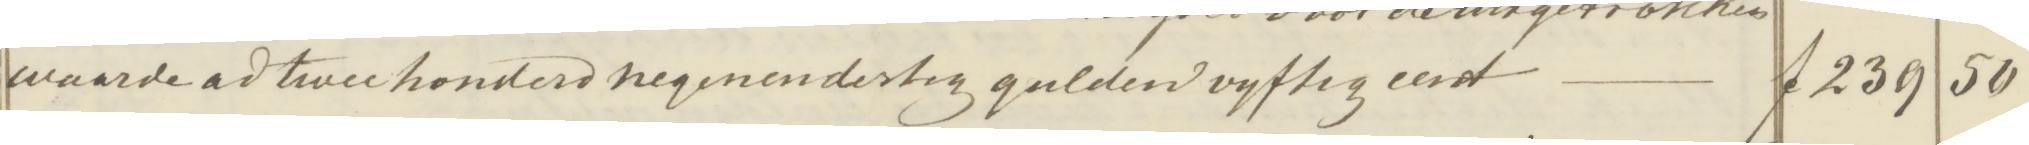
waarde ad twee honderd negenendertig gulden vyftig cent ƒ239 50
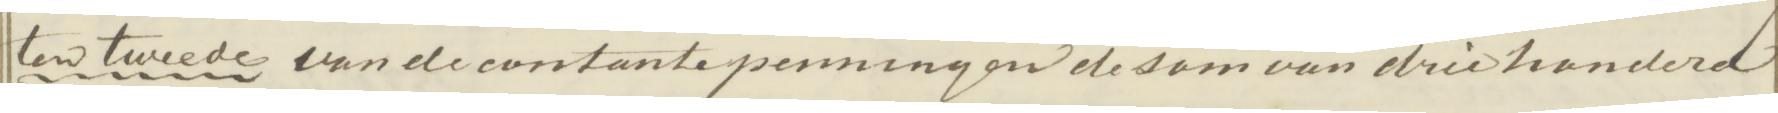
ten tweede van de contante penningen de som van drie honderd
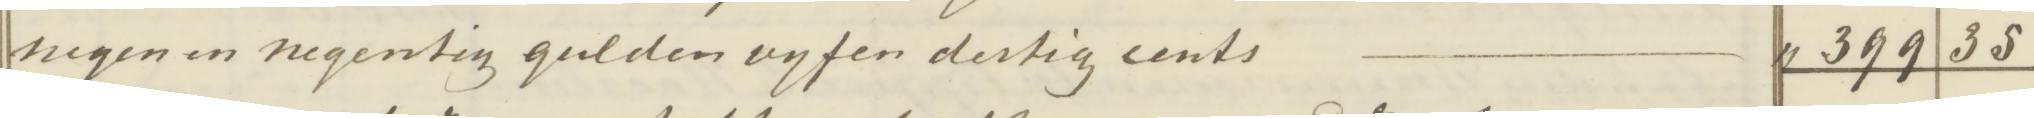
negen en negentig gulden vyf en dertig cents „ 399 35
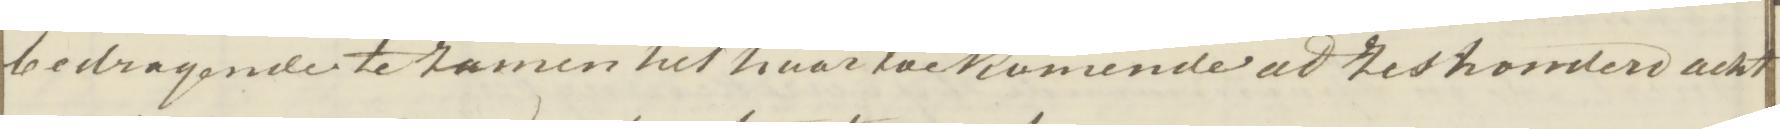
bedragende te zamen het haar toekomende ad zeshonderd acht
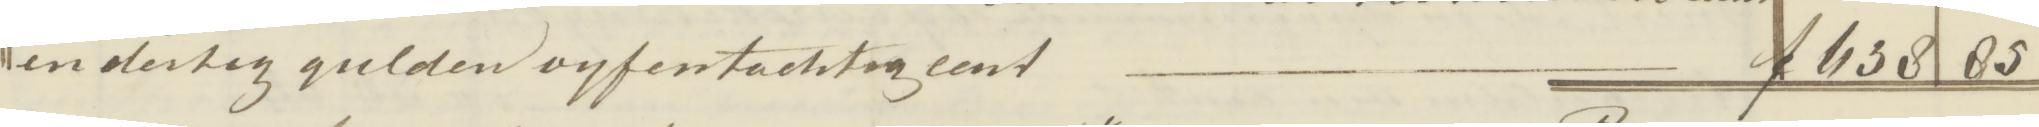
en dertig gulden vyf en tachtig cent ƒ 638 85
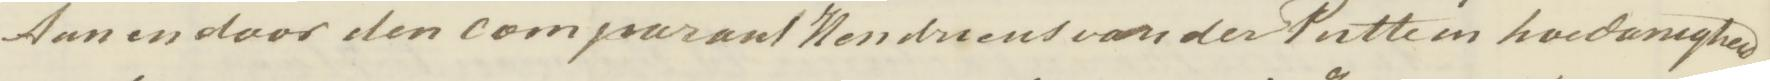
Aan en door den comparant Hendricus van der Putte in hoedanigheid
